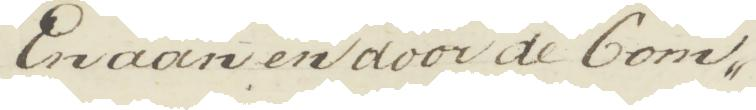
En aan en door de Com„
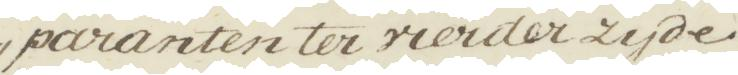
paranten ter vierder zyde
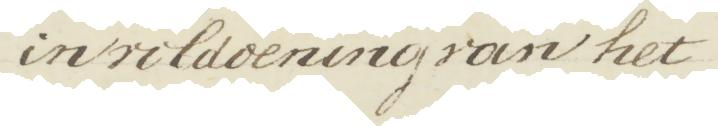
in voldoening van het
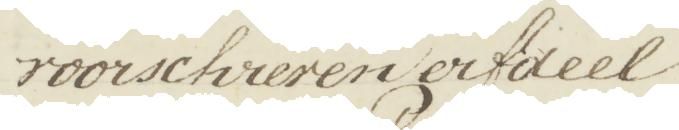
voorschreven erfdeel
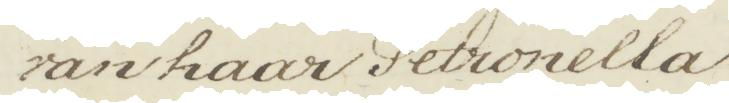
van haar Petronella
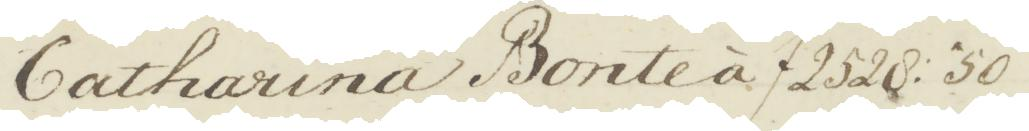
Catharina Bonte à ƒ2528: 50
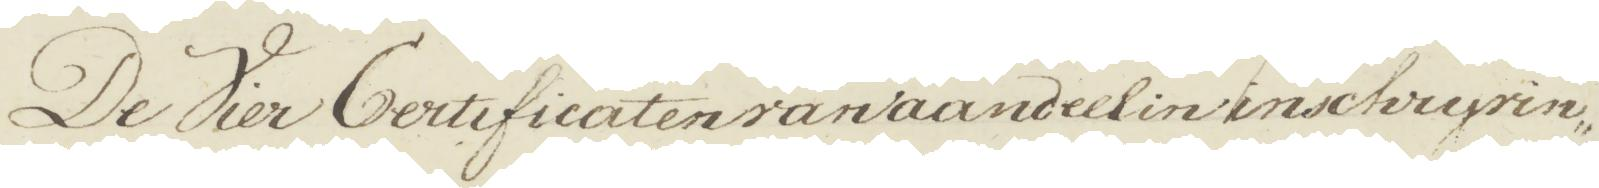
De Vier Certificaten van aandeel in inschryvin„
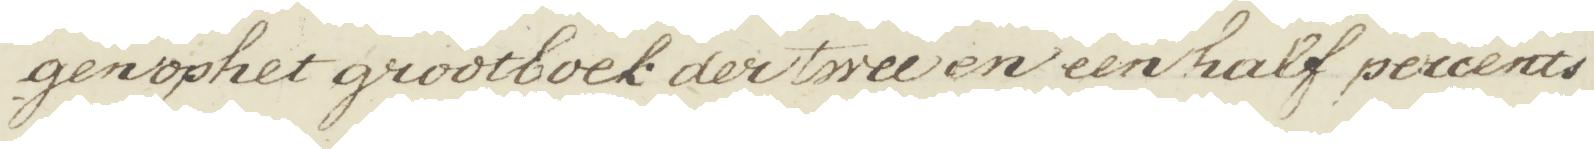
gen op het grootboek der twee en een half percents
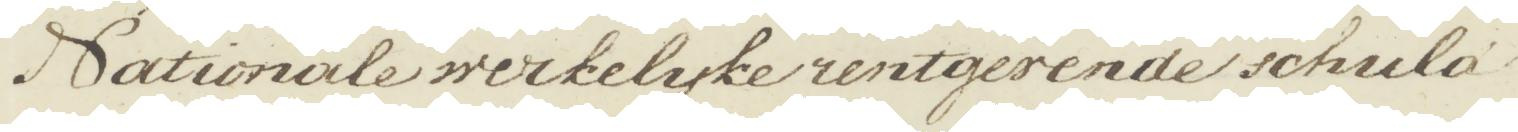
Nationale werkelyke rentgevende schuld
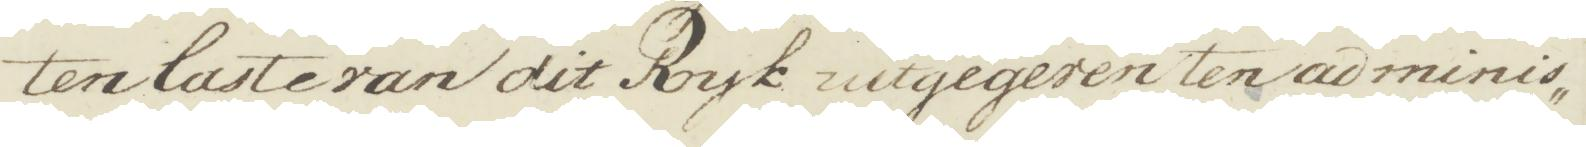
ten laste van dit Ryk uitgegeven ten adminis„
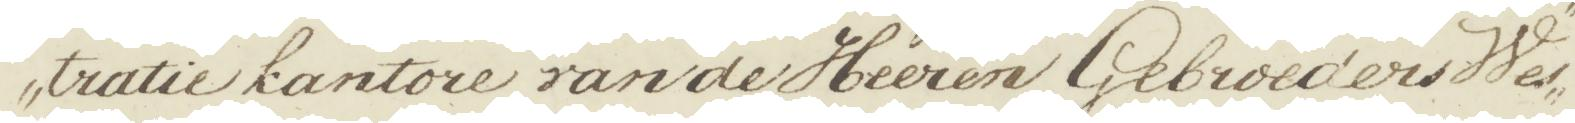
„tratie kantore van de Heeren Gebroeders Wes„
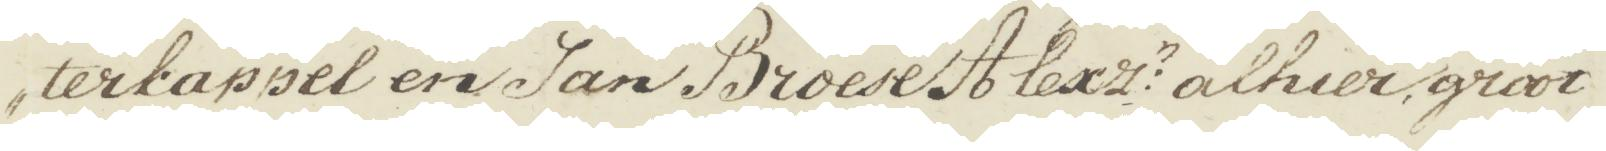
„terkappel en Jan Broese Alexz:n alhier, groot
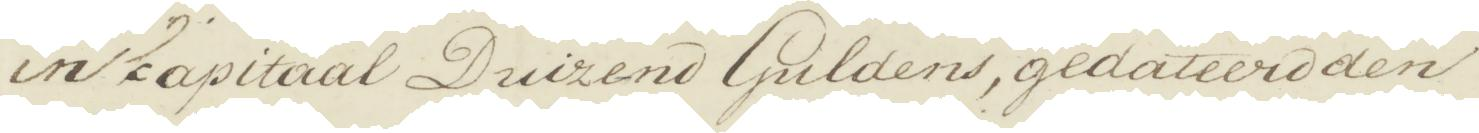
in kapitaal Duizend Guldens, gedateerd den
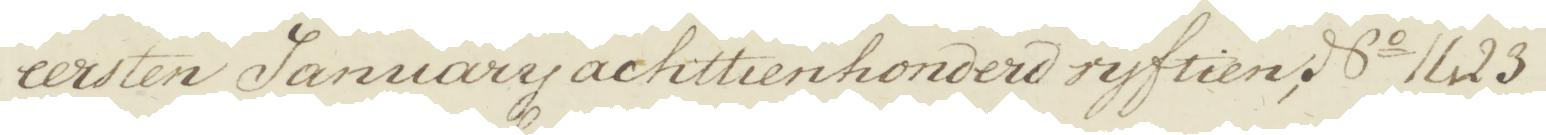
eersten January achttienhonderd vyftien N=o 1423
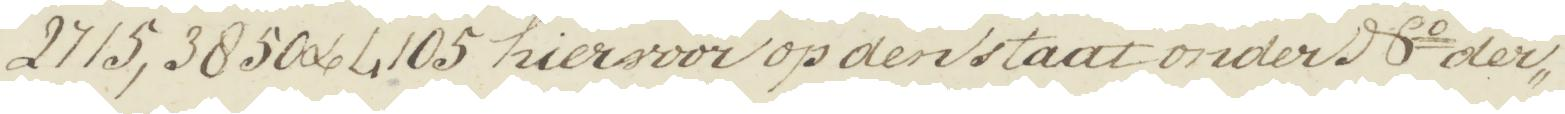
2715, 3850 & 4105 hiervoor op den staat onder N=o der„
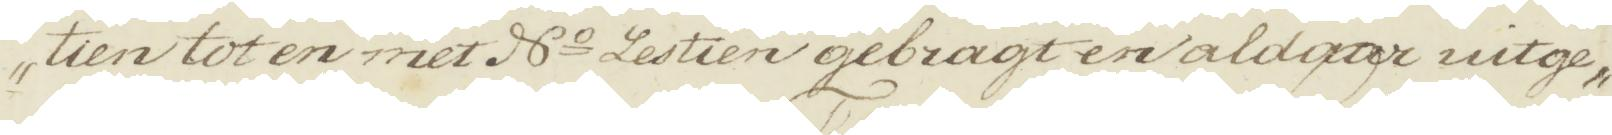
„tien tot en met N=o zestien gebragt en aldaar uitge„
